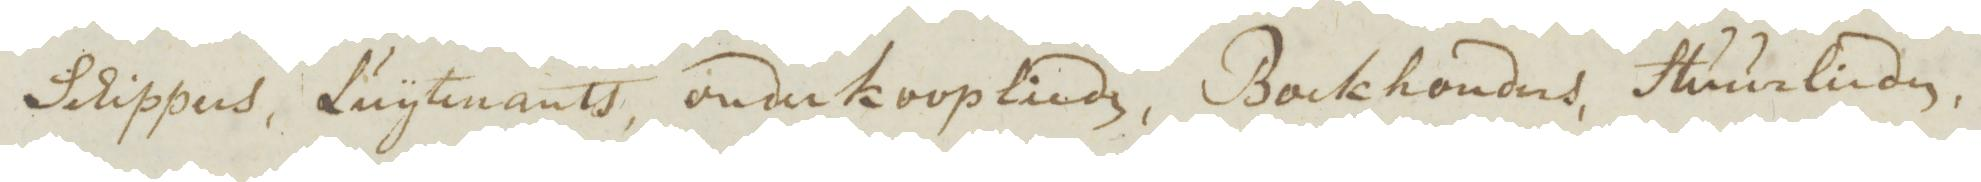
schippers, Luijtenants, onderkooplieden, Boekhouders, stuurlieden,
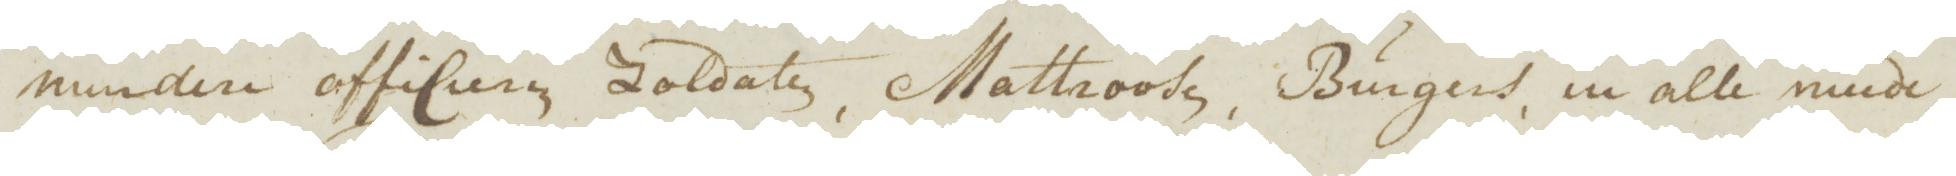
mindere officieren zoldaten, Mattroosen, Burgers, en alle meede
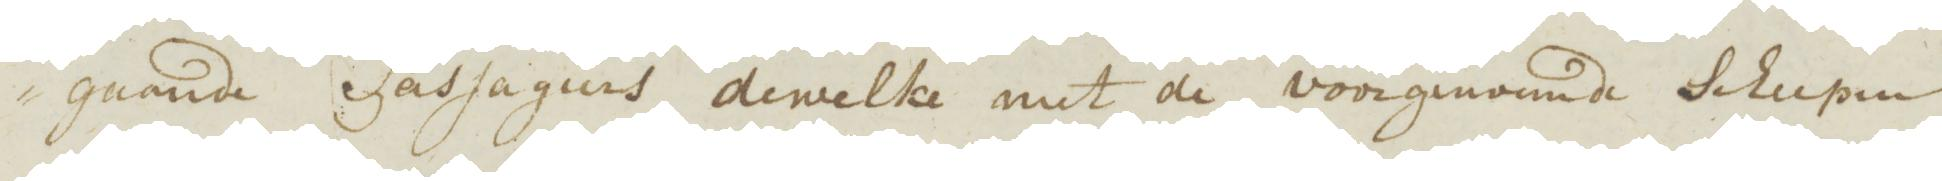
„gaande Passagiers, dewelke met de voorgenoemde scheepen
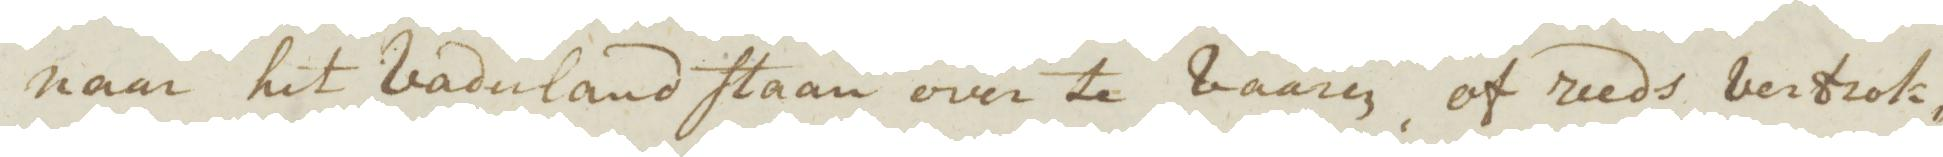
naar het Vaderland staan over te vaaren, of reeds vertrok„
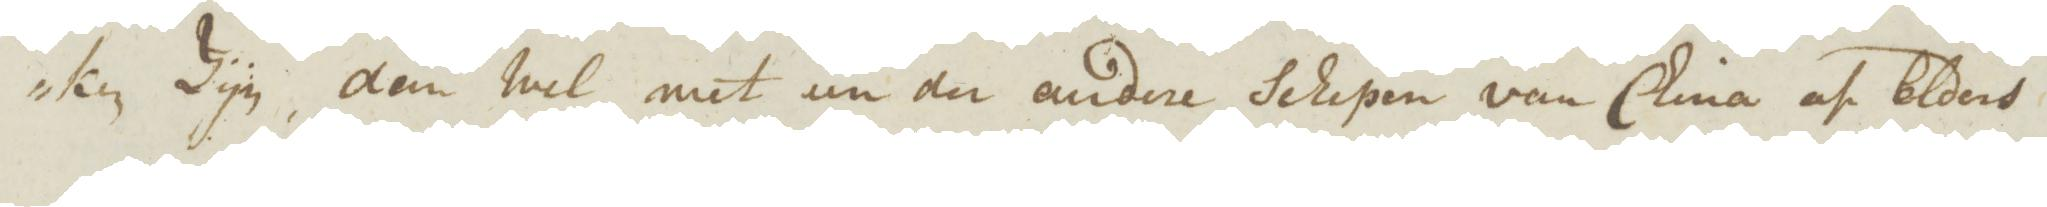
„ken zijn, dan wel met een der andere schepen van China of Elders
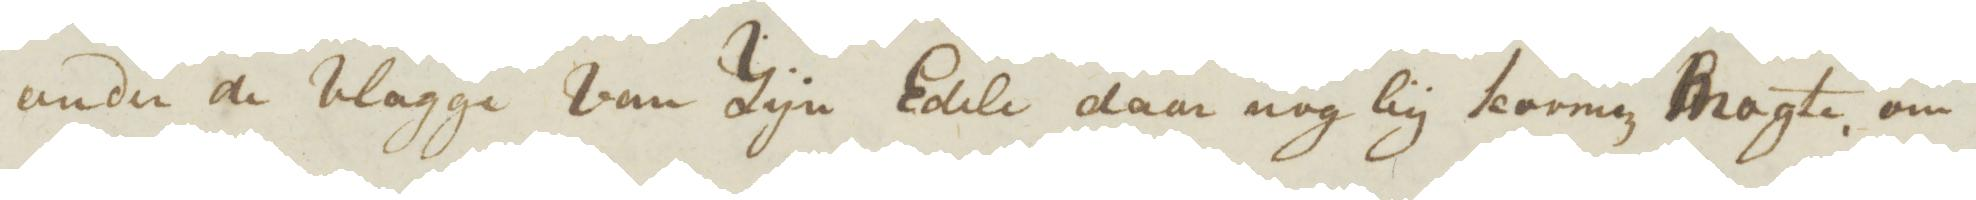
onder de vlagge van zijn Edele daar nog bij koomen Mogte, om
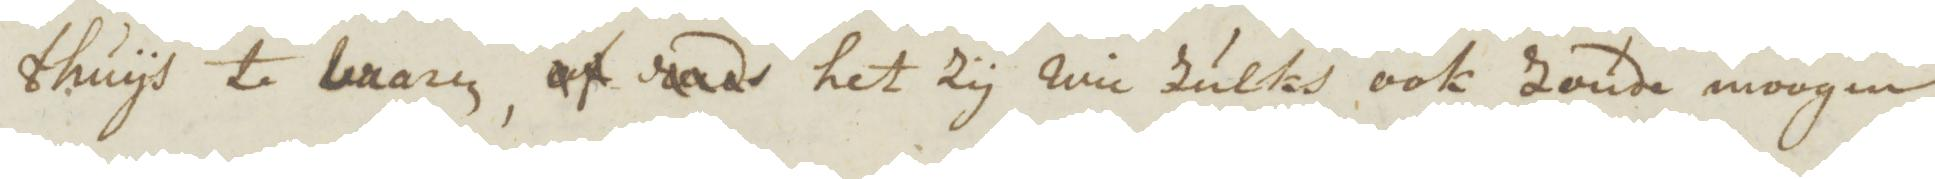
thuijs te vaaren, of reeds het zij wie zulks ook zoude moogen
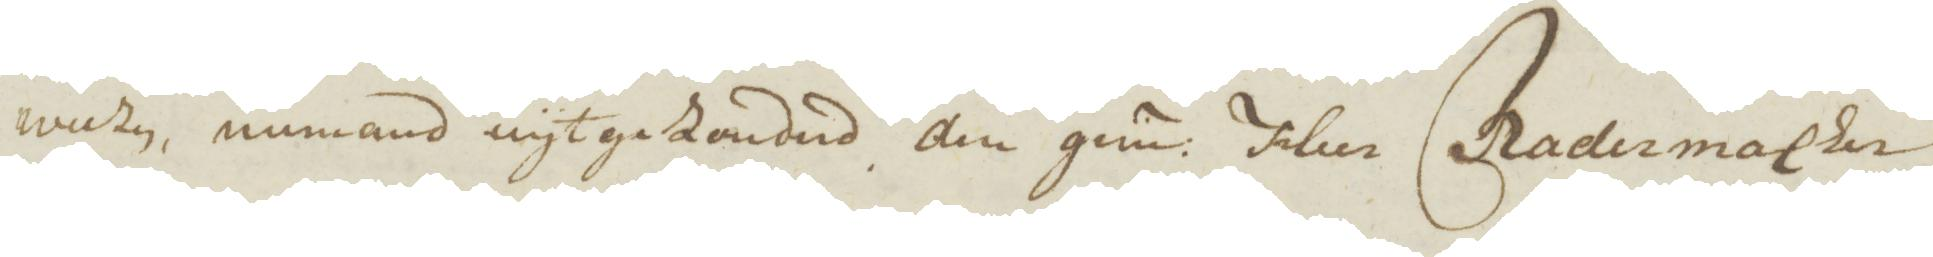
weezen, niemand uijtgezonderd, dan gem: Heer Radermacher
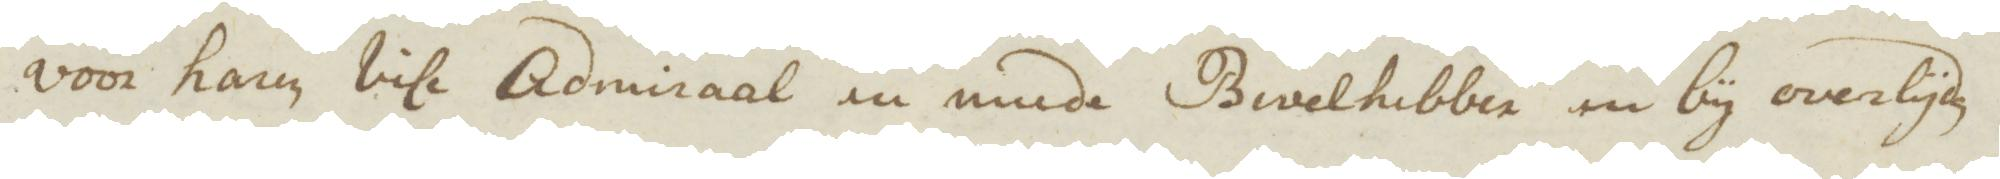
voor haren vice Admiraal en mede Bevelhebber en bij overlijden
